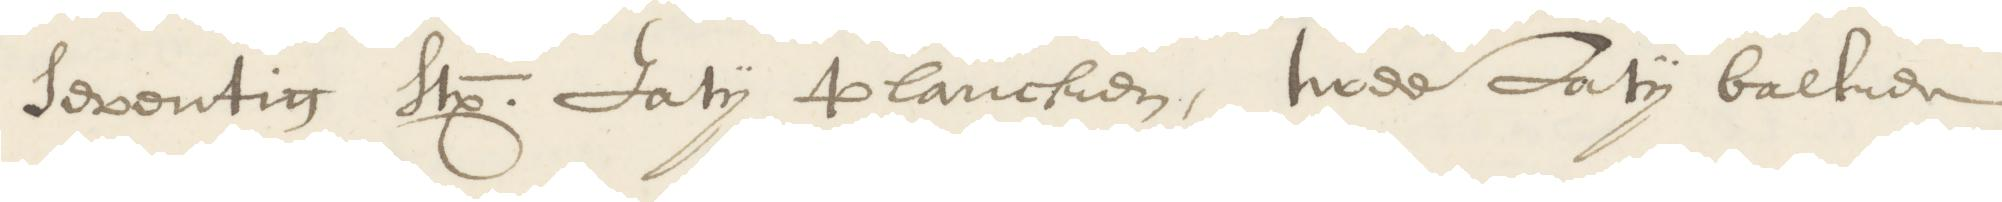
seventig stx: Jatij plancken, twee Jatij balken
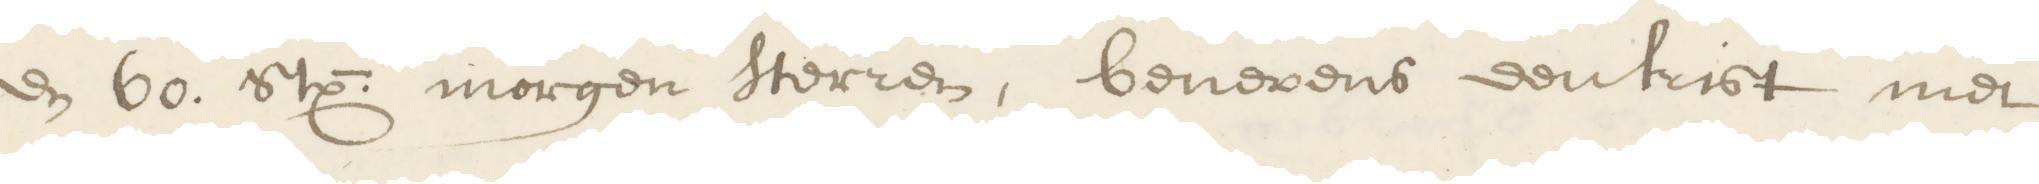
en 60. stx: morgen sterren, benevens eenkist met
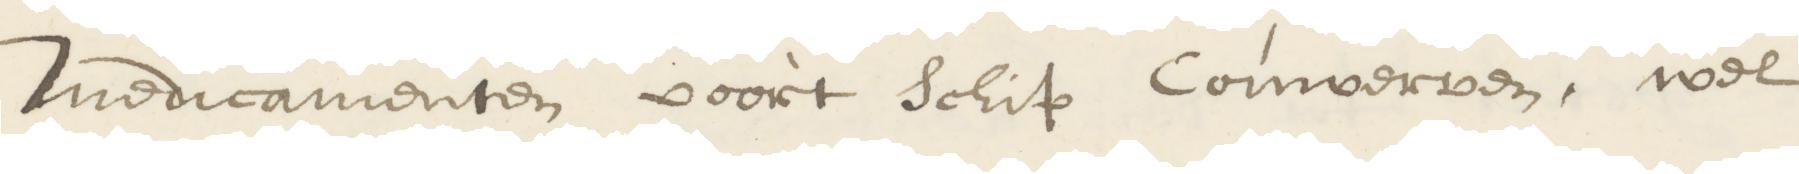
Medicamenten voor't schip Couwerven, wel
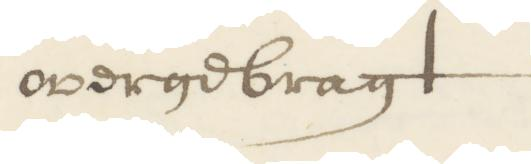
overgebragt
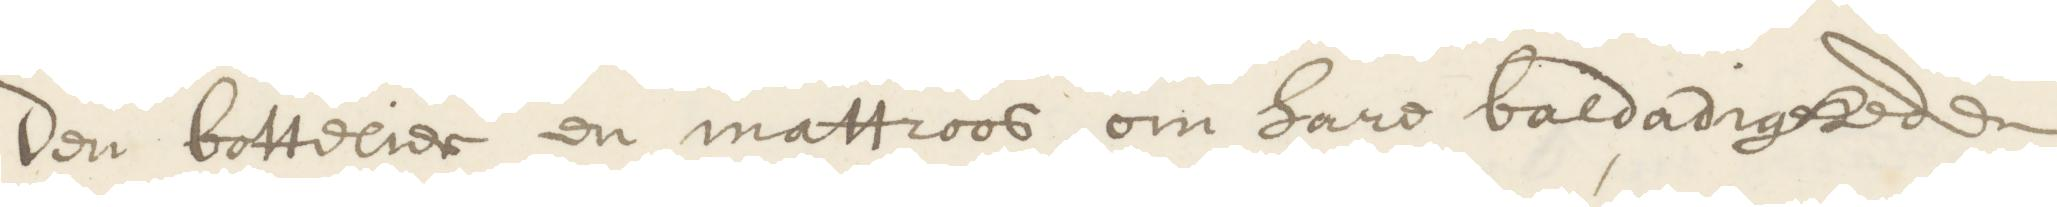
Den bottelier en mattroos om hare baldadigheden
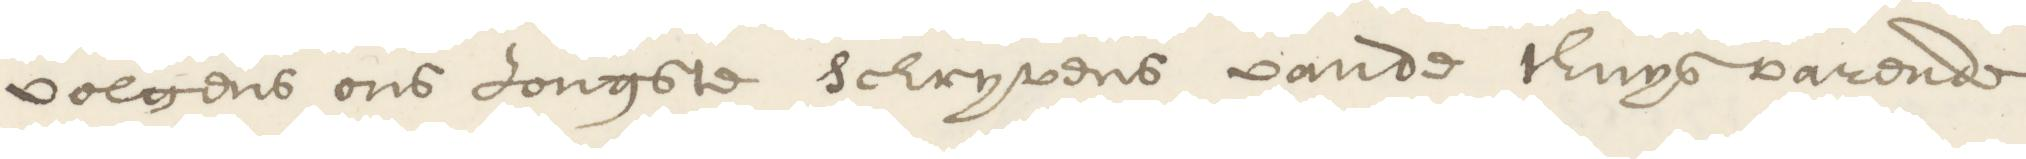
volgens ons jongste schrijvens vande thuijsvarende
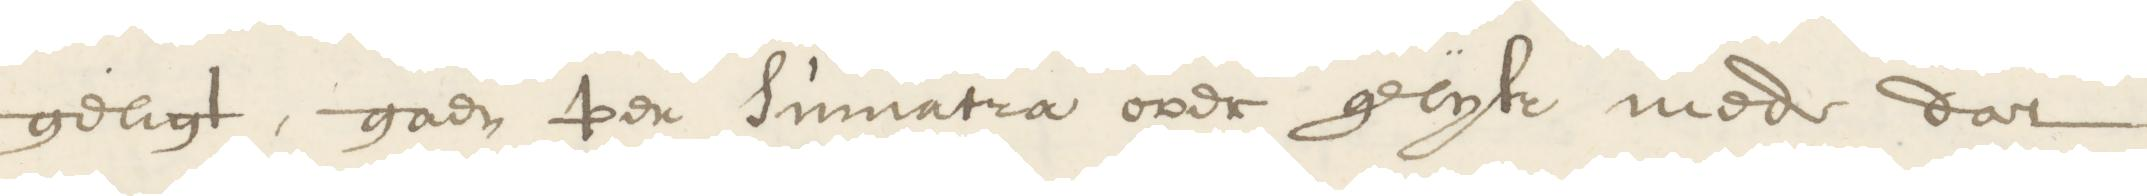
geligt, gaen per Sumatra over gelijk mede dat
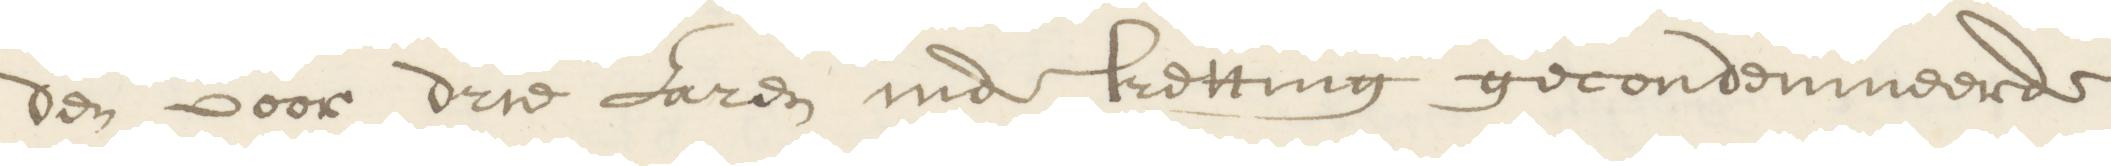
den voor drie jaren inde ketting gecondenmeerde
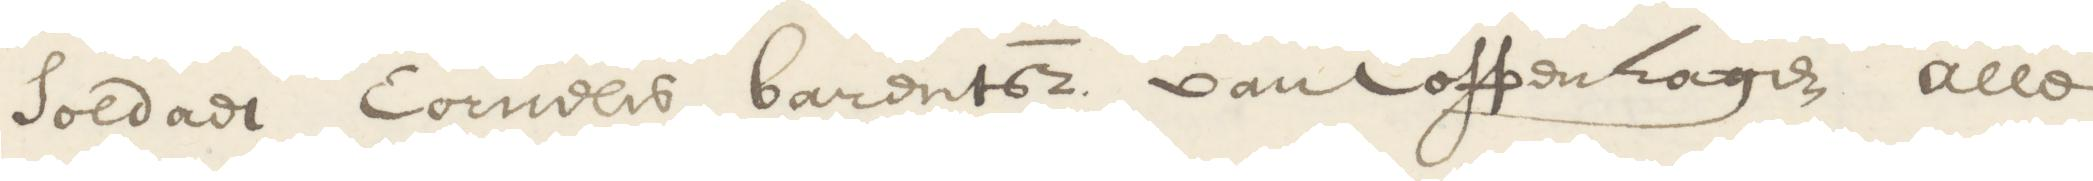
soldaet Cornelis barentsz. van Coppenhagen alle
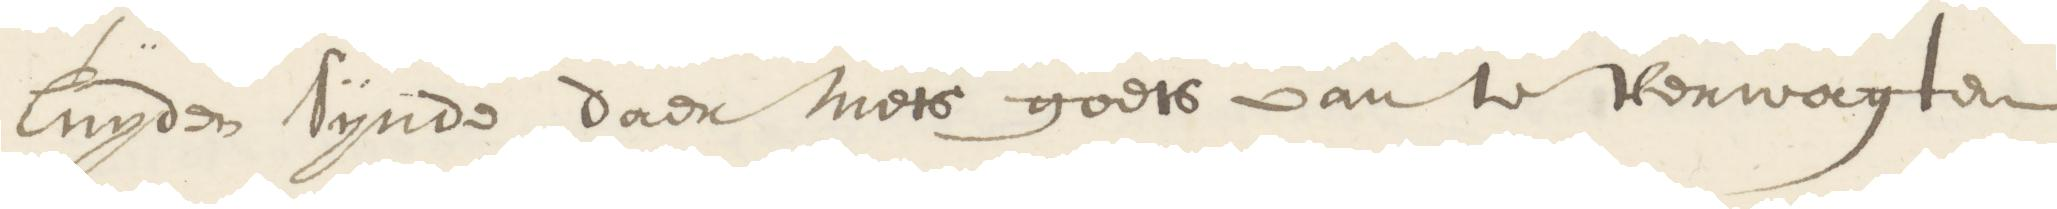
luijden sijnde daer niets goets van te verwagten
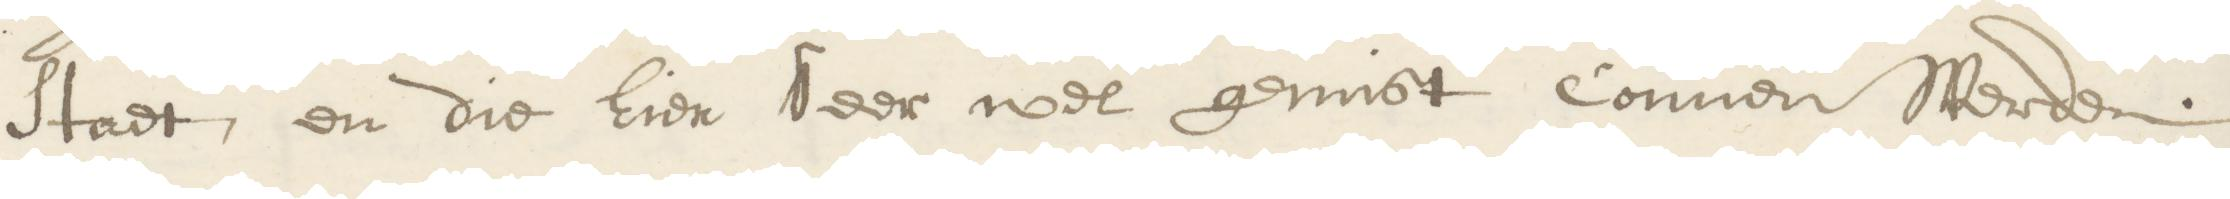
staet, en die hier seer wel gemist connen Werden.
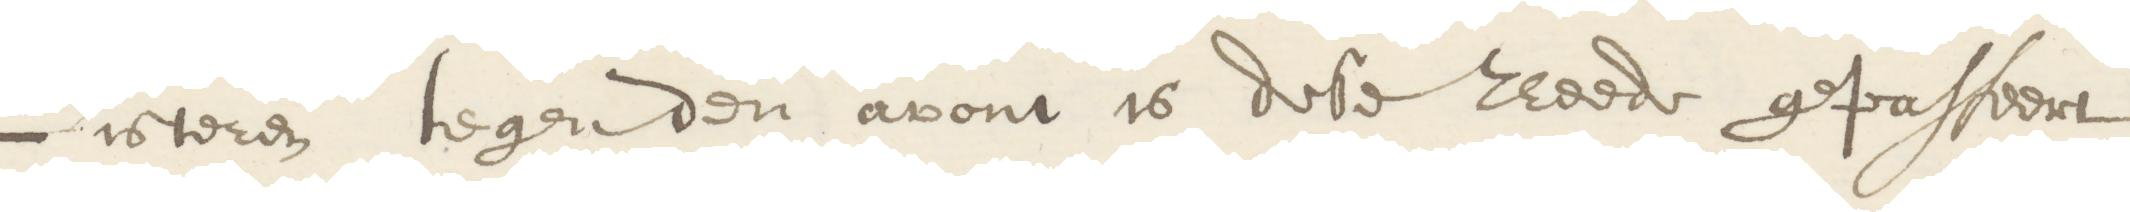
isteren tegen den avont is dese rheede gepasseert
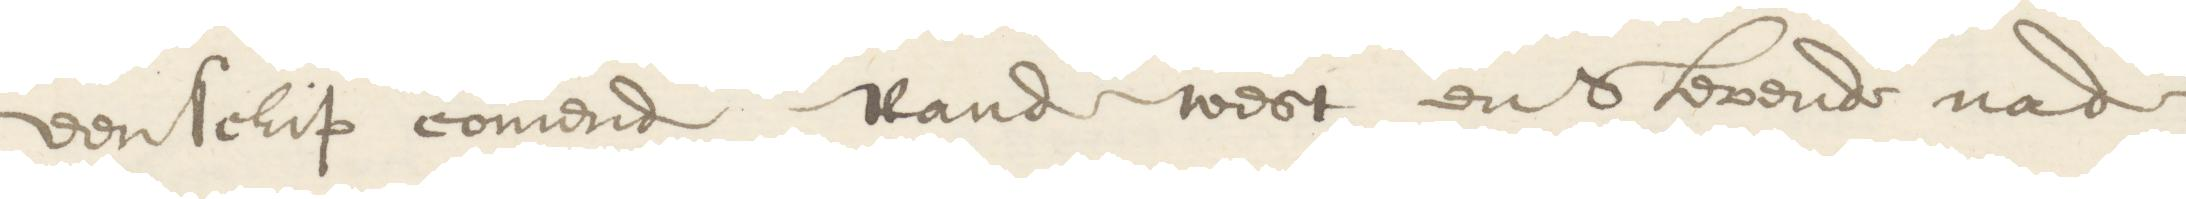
een schip comende vande west en stevende nade
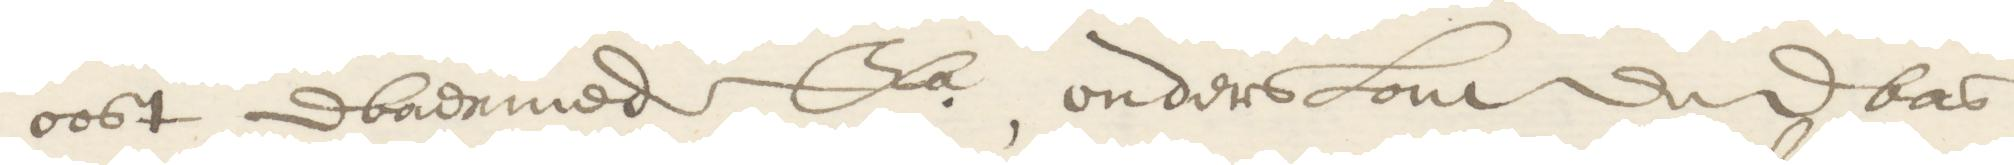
oost waermede E.a, onderstont en was
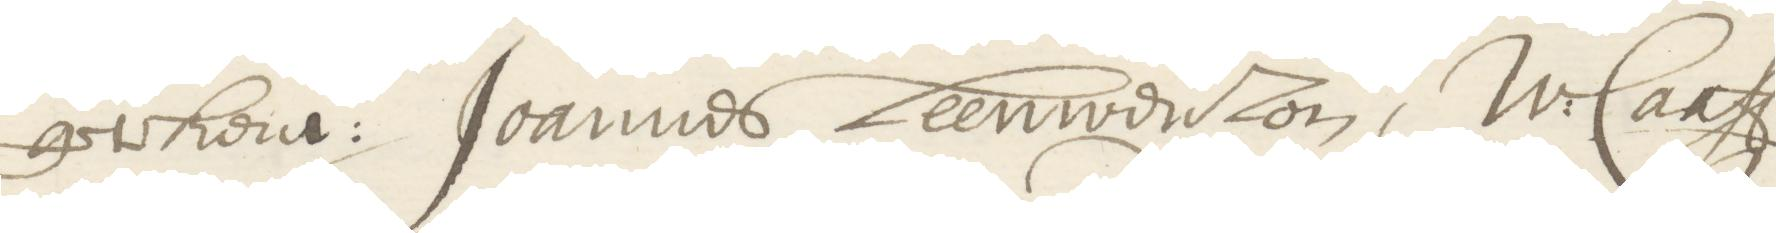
getekent: Joannes Leeuwenzon, W: Carff
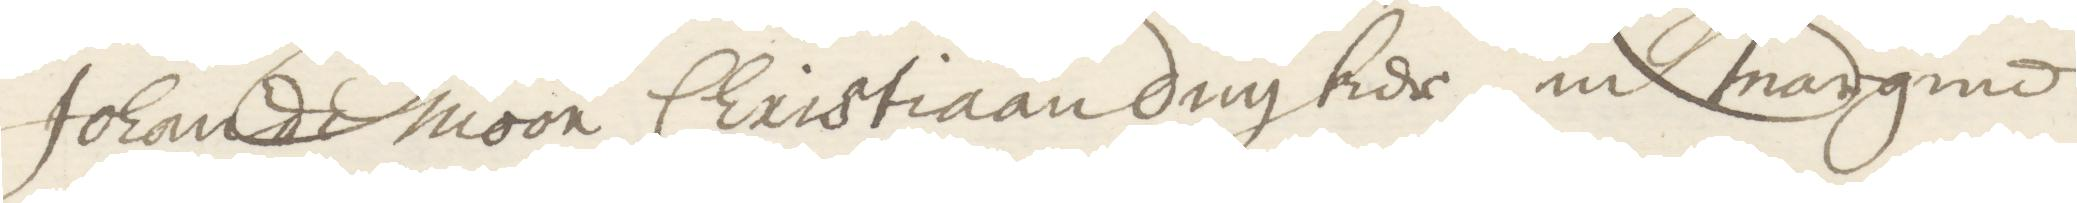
Johan de moor Christiaan duijker in margine
